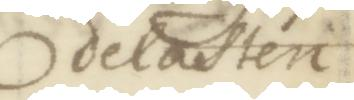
delasten
